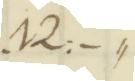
12: – „
